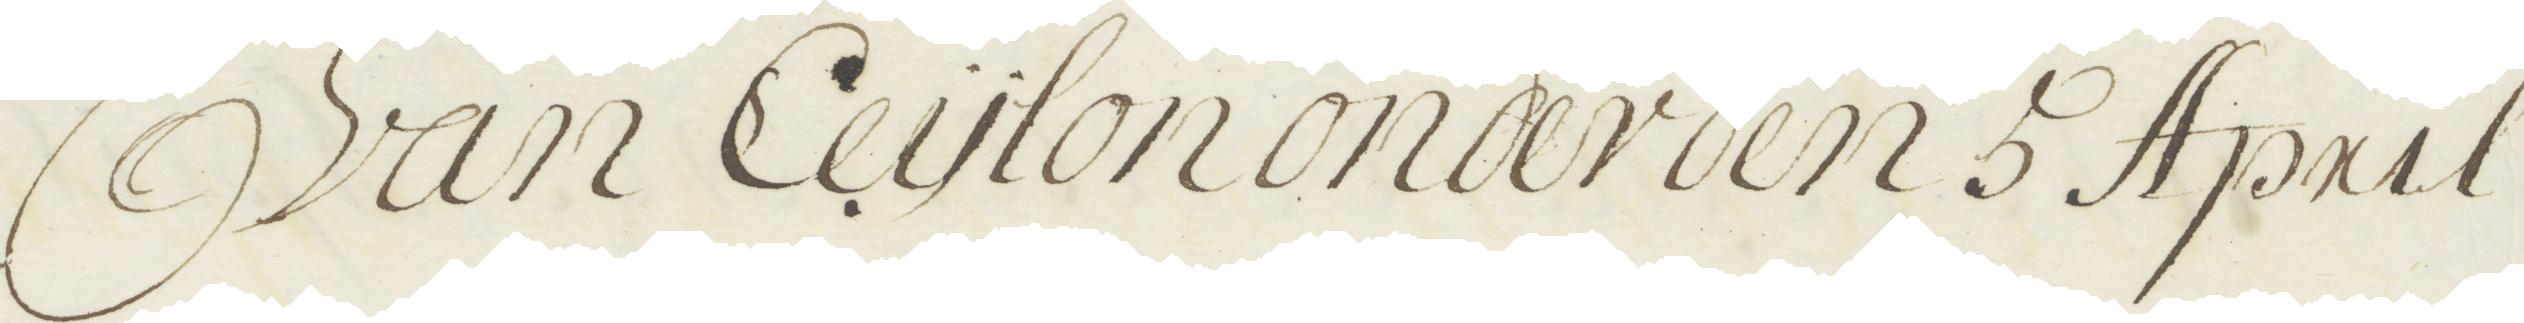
Van Ceijlon onder den 5 April
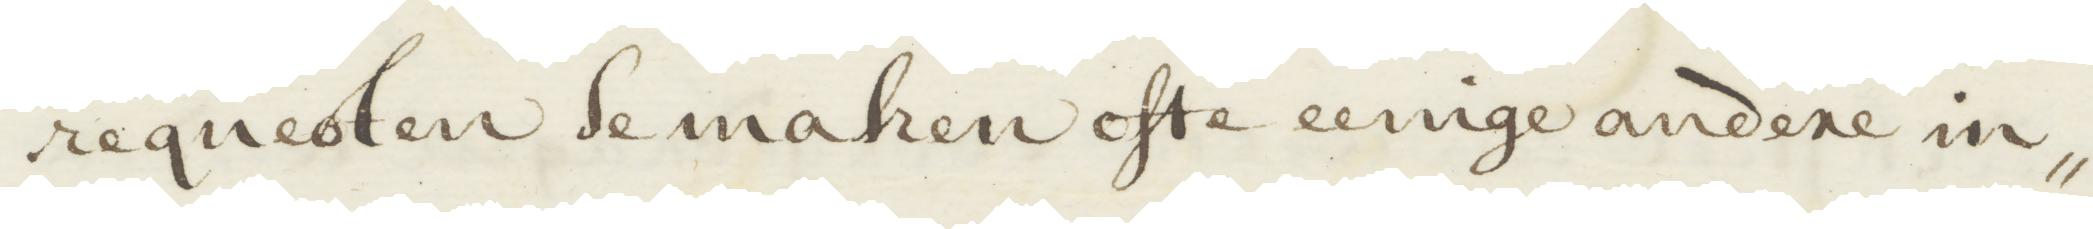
requesten te maken ofte eenige andere in„
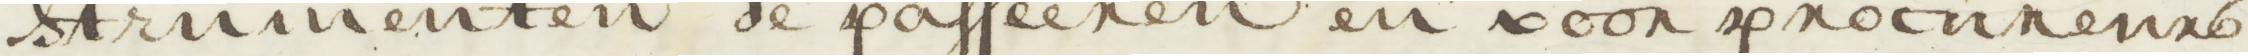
strumenten te passeeren en voor procureurs
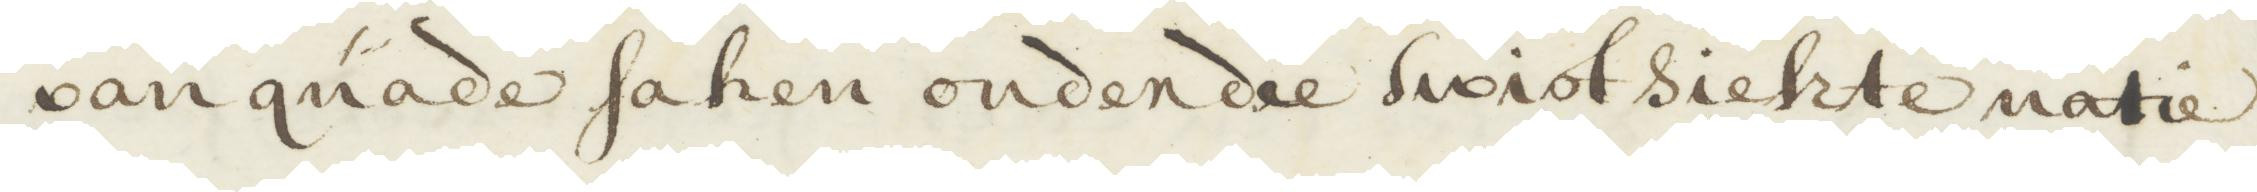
van quade saken onder die twist siekte natie
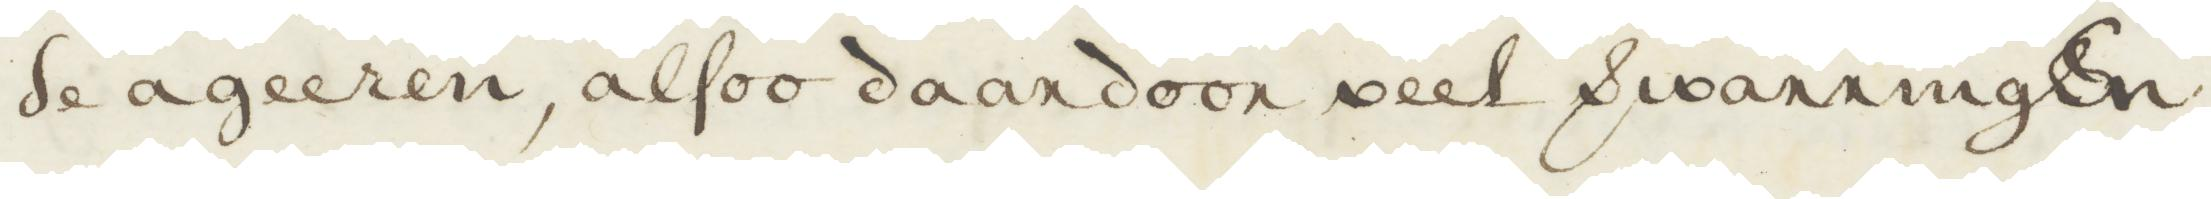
te ageeren, alsoo daar door veel verwarringen
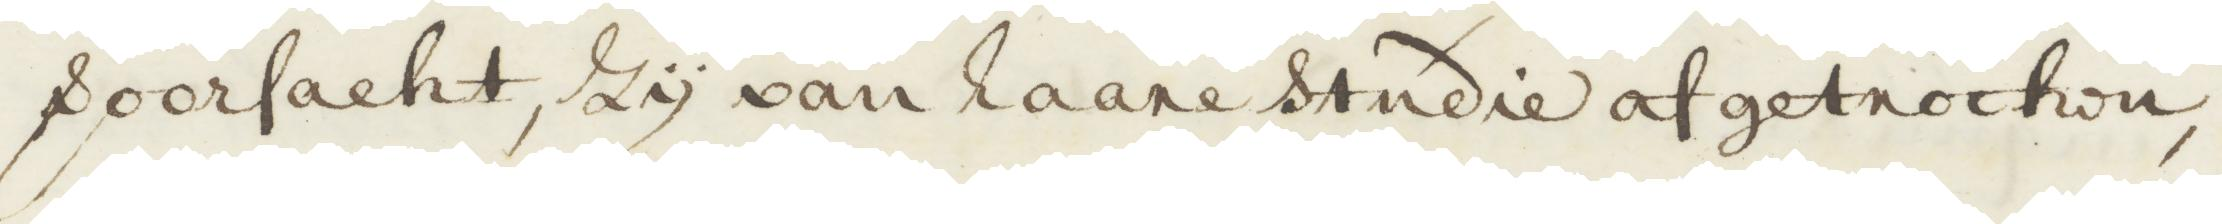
veroorsaekt, zij van haare studie afgetrocken,
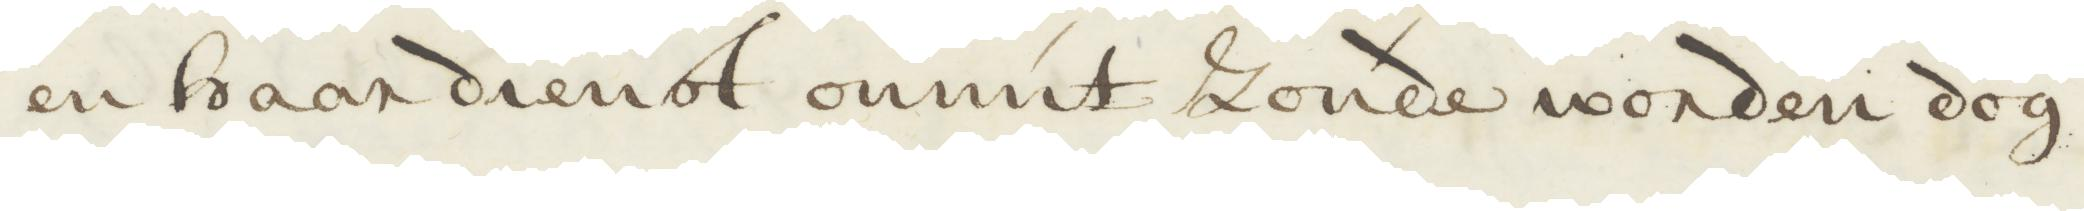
en haar dienst onnut zoude worden dog
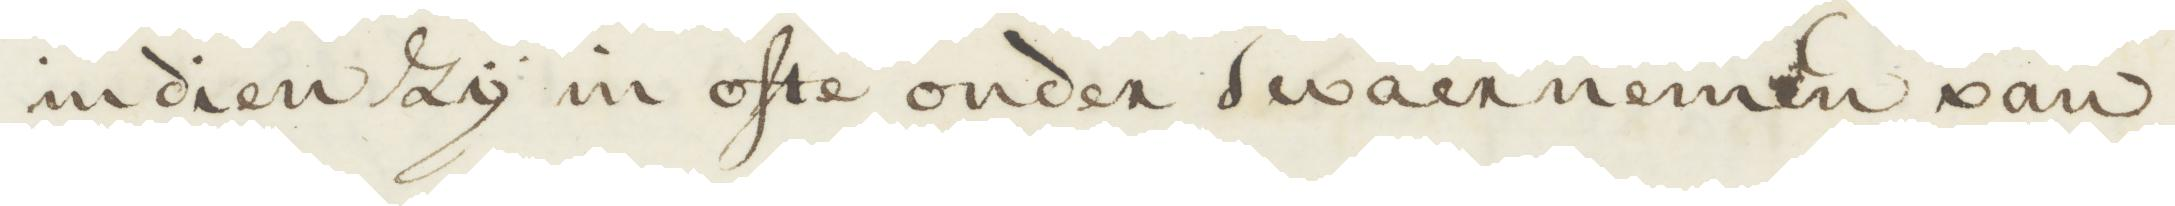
in dien zij in ofte onder t waernemen van
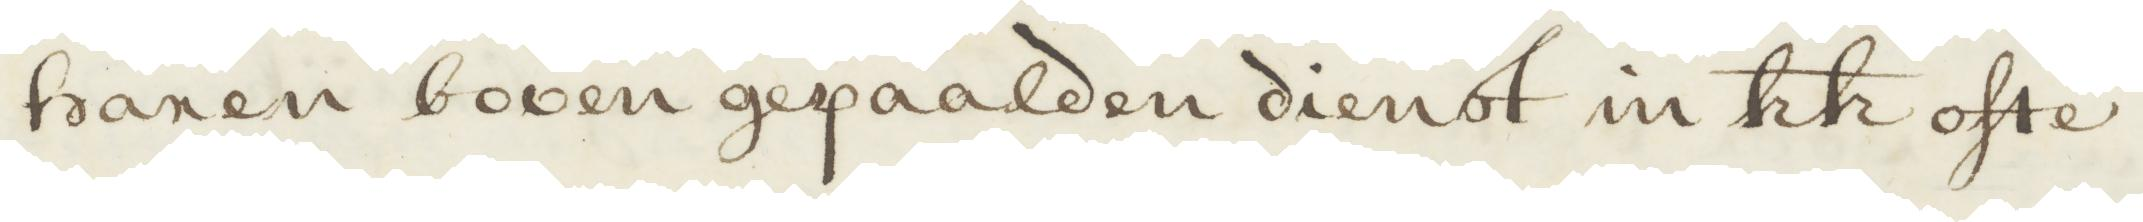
haren boven gepaalden dienst in kk ofte
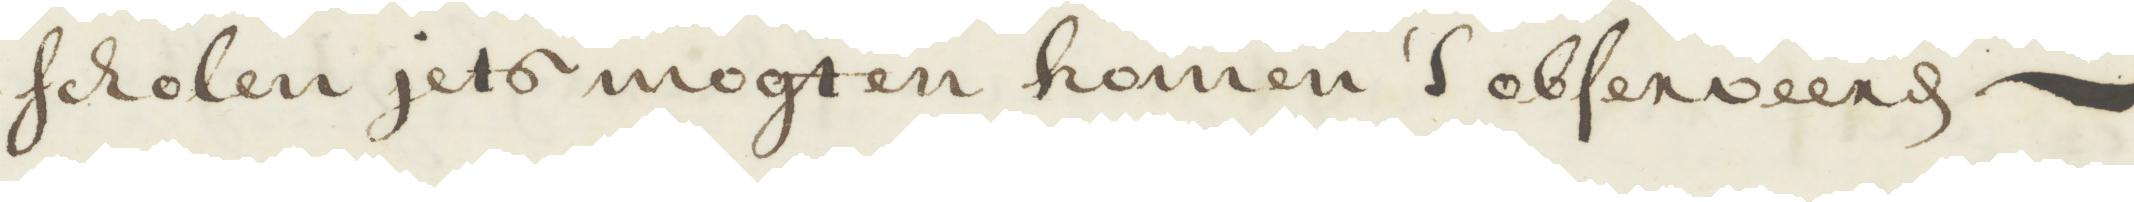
scholen jets mogten komen ’t observeeren
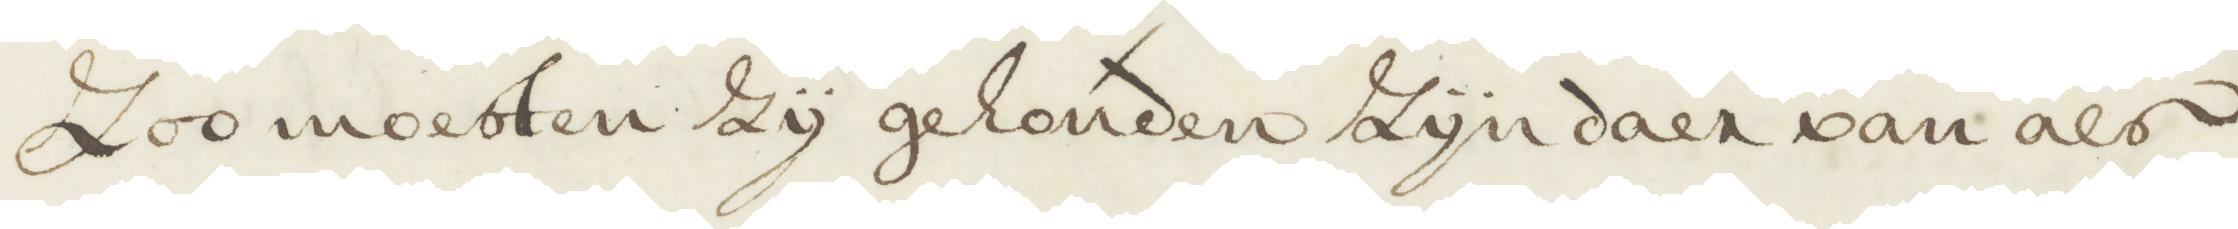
zoo moesten zij gehouden zijn daer van als
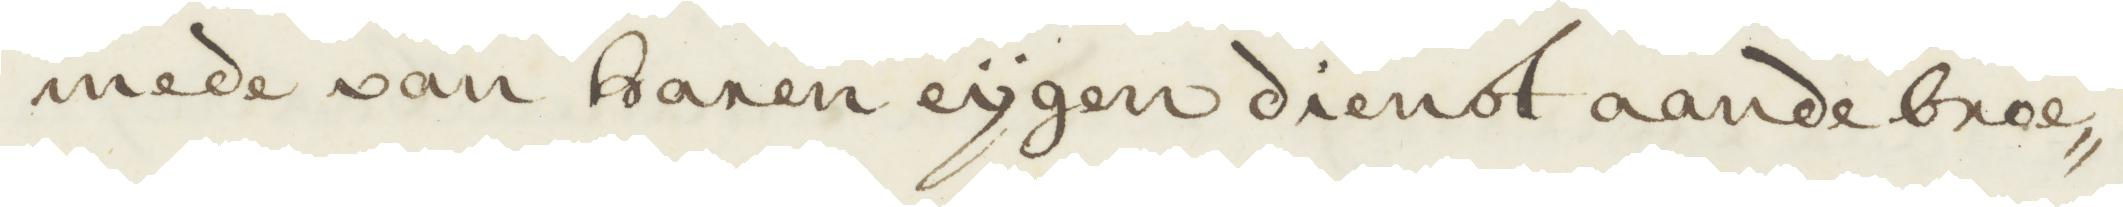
mede van haren eijgen dienst aande broe„
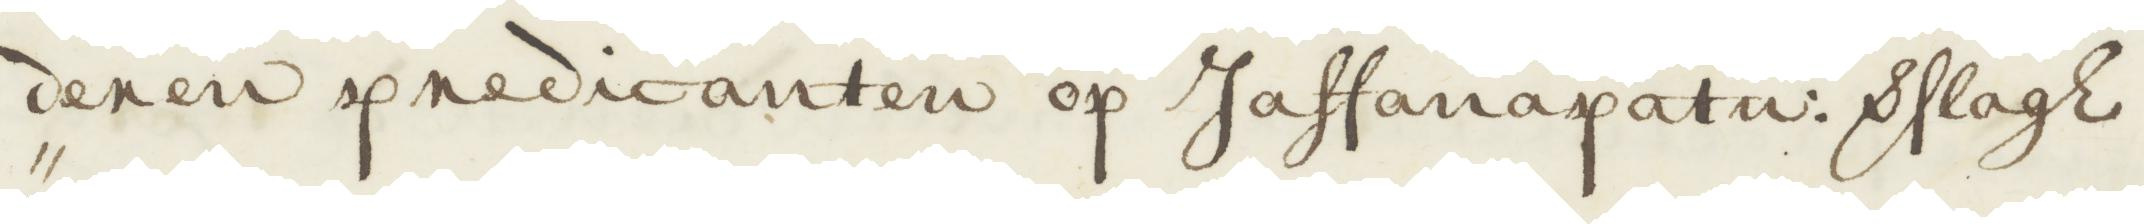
„deren predicanten op Jaffanapatn: verslagh
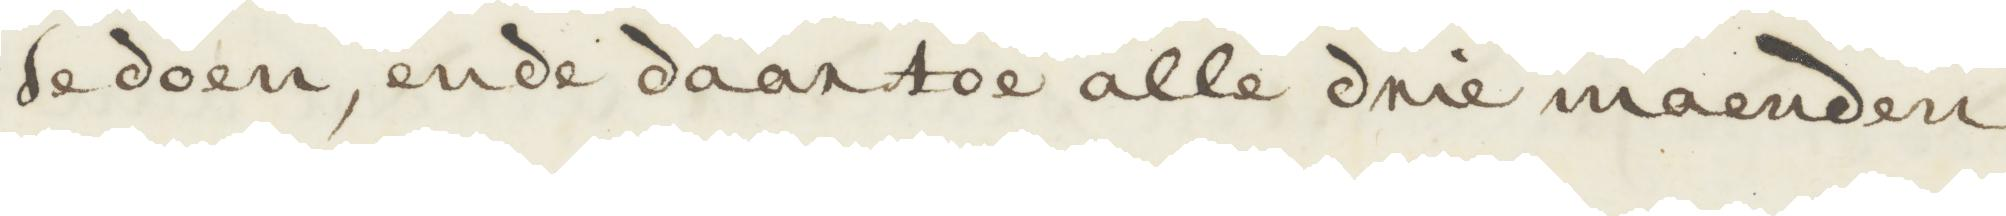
te doen, ende daar toe alle drie maenden
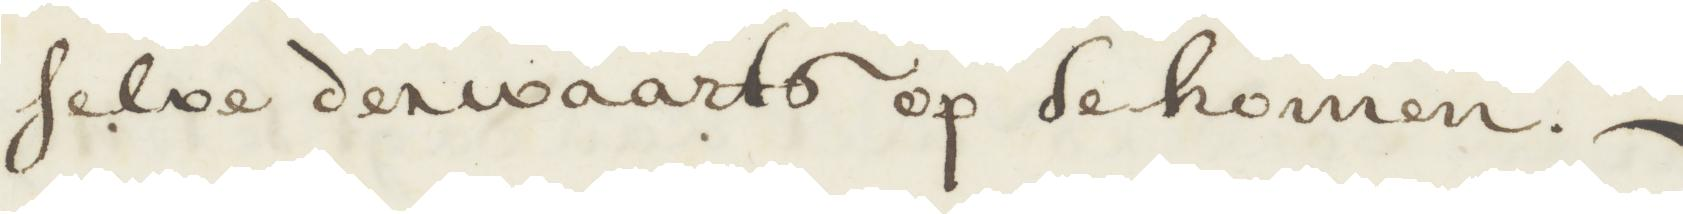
selve derwaarts op te komen.
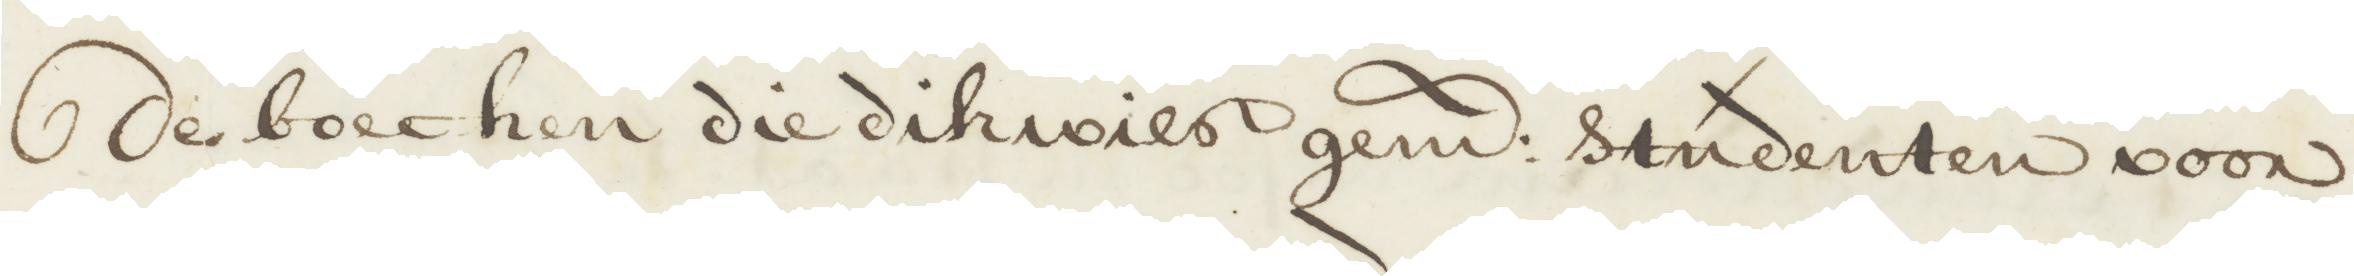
de boecken die dikwils gem: studenten voor
